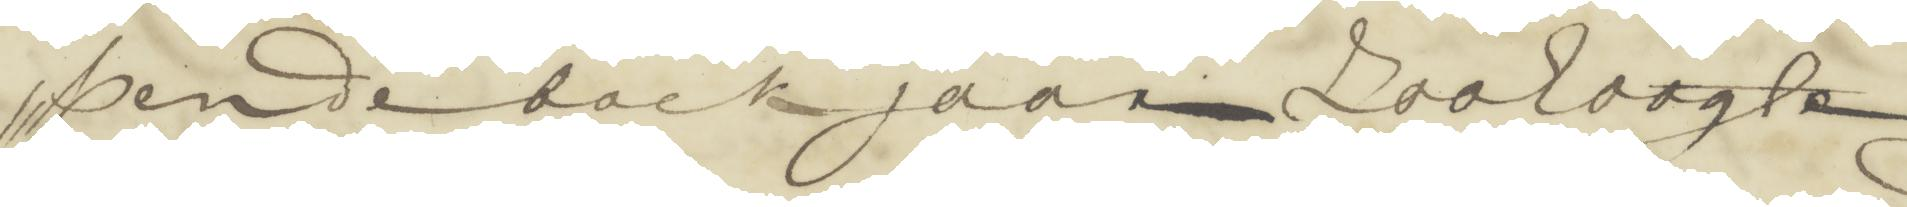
„pende boek jaar zoohoogte
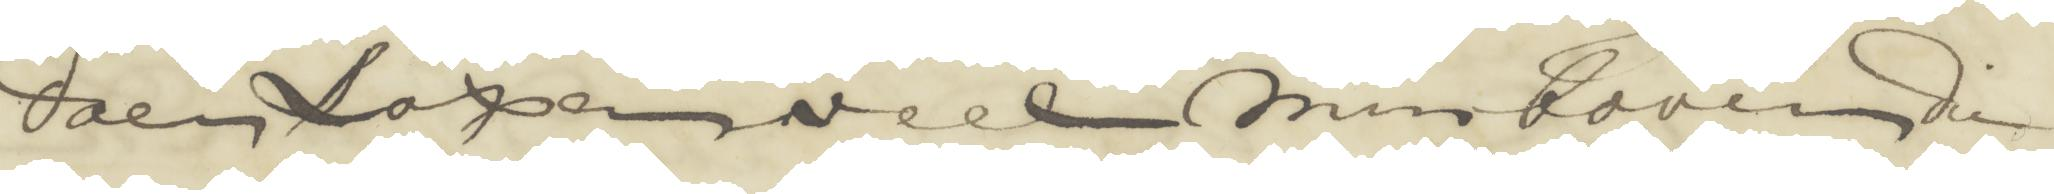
doen lopen veel min boven die
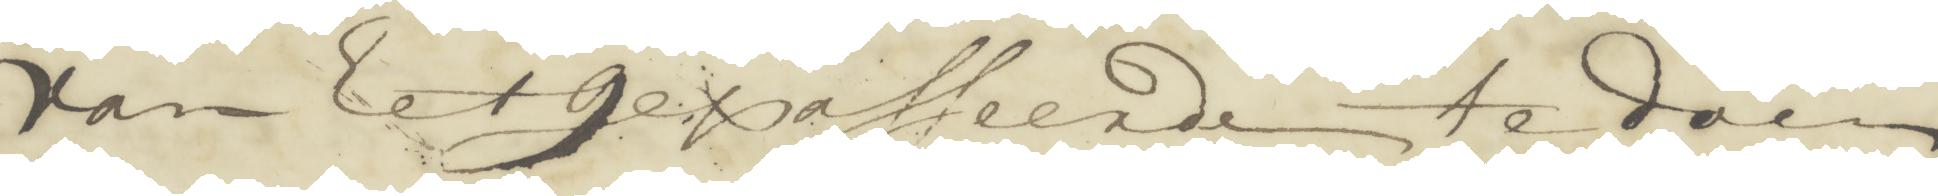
van het gepasseerde te doen
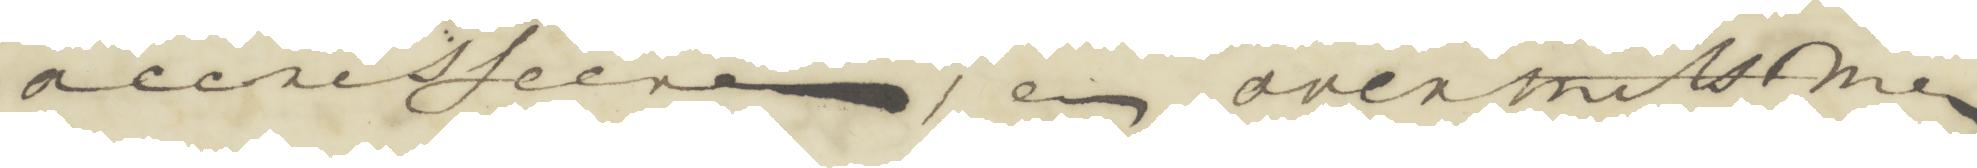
accresseeren, en overmits men
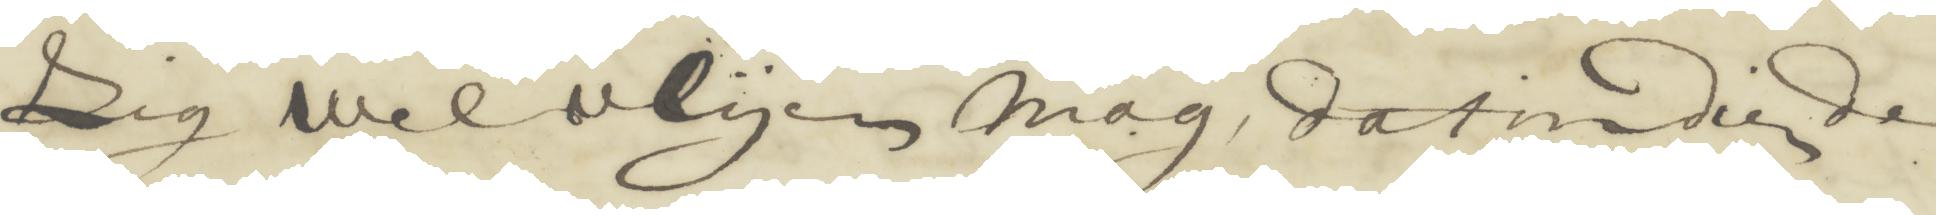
zig wel vlijen mag, dat indien de
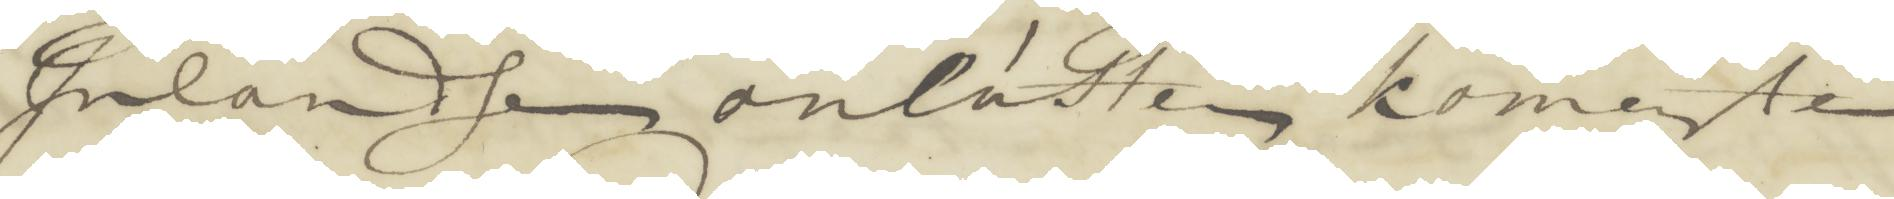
Jnlandse onlusten komen te
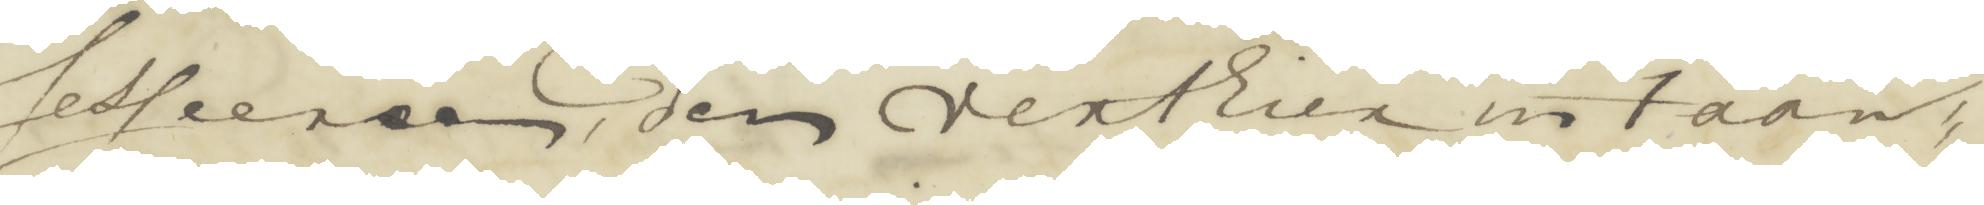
sesseereen, den verthier in 't aan„
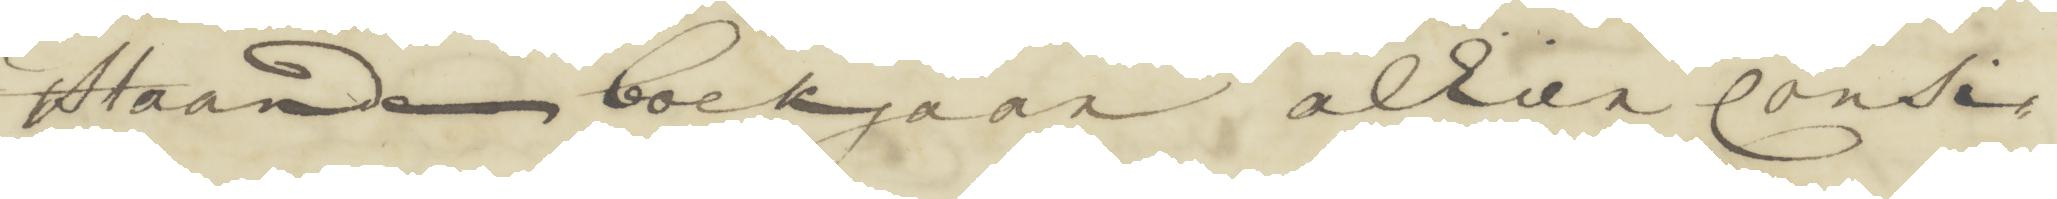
„staande boekjaar alhier consi„
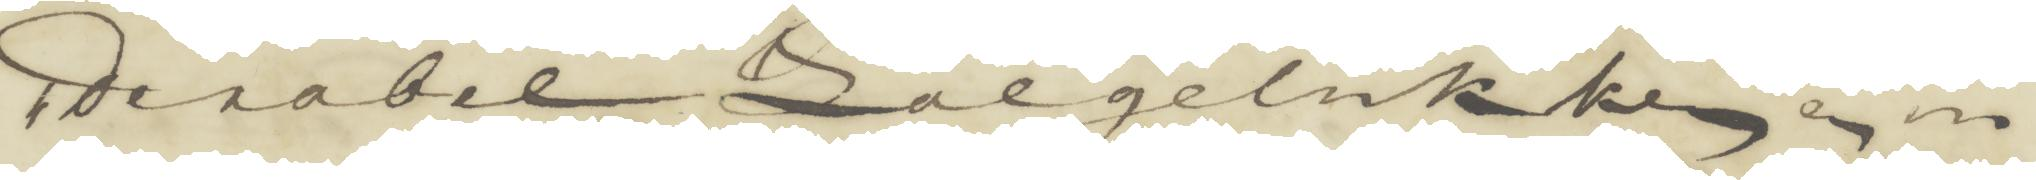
„derabel zalgelukken en in
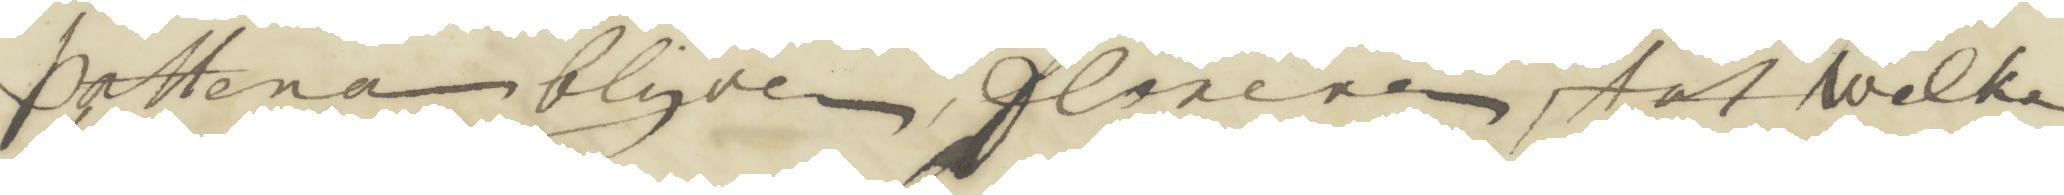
pattena blijven, floreren, tot welke
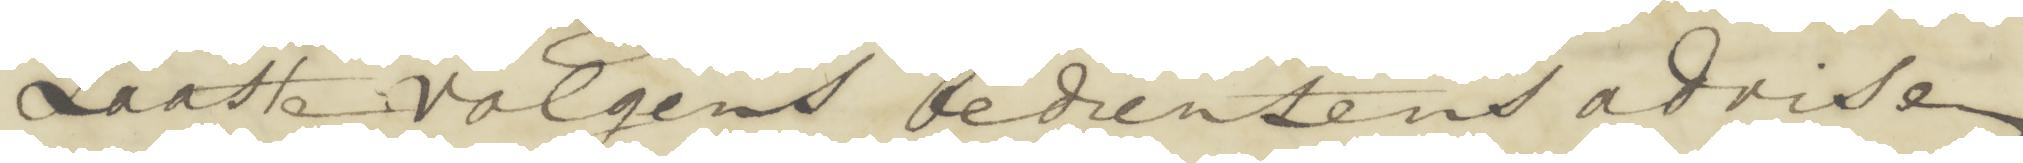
laaste: volgens bedientens advisen
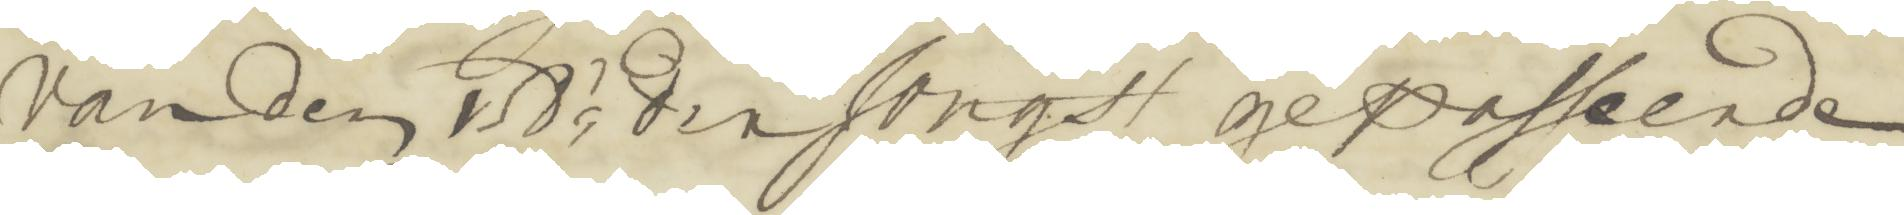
van den 18=' der Jongst gepasseerde
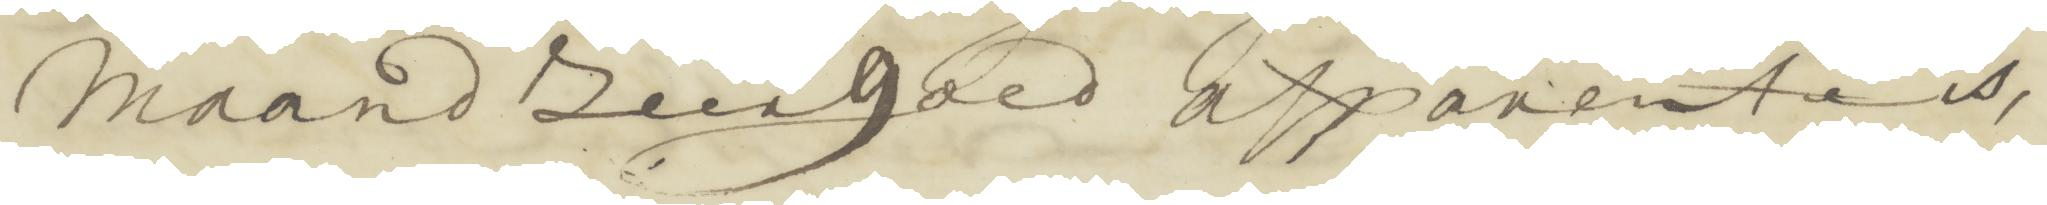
maand zeer goed apparentie is,
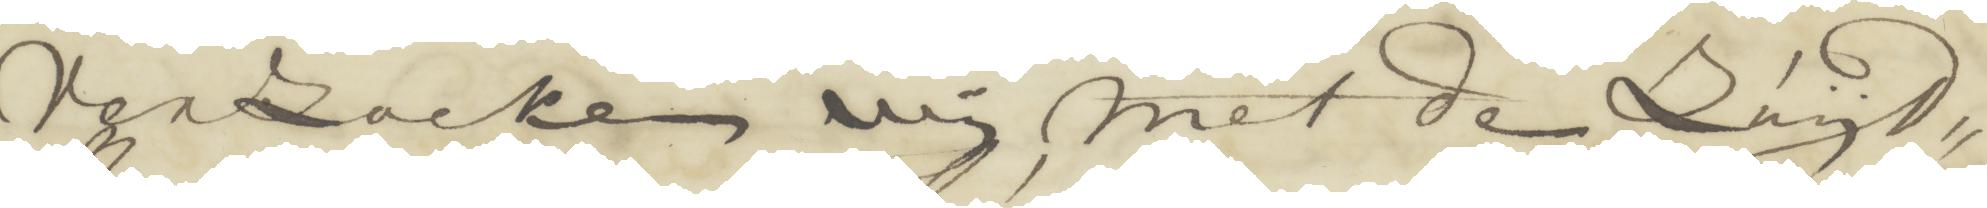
verzoeken wij met de zuijd„
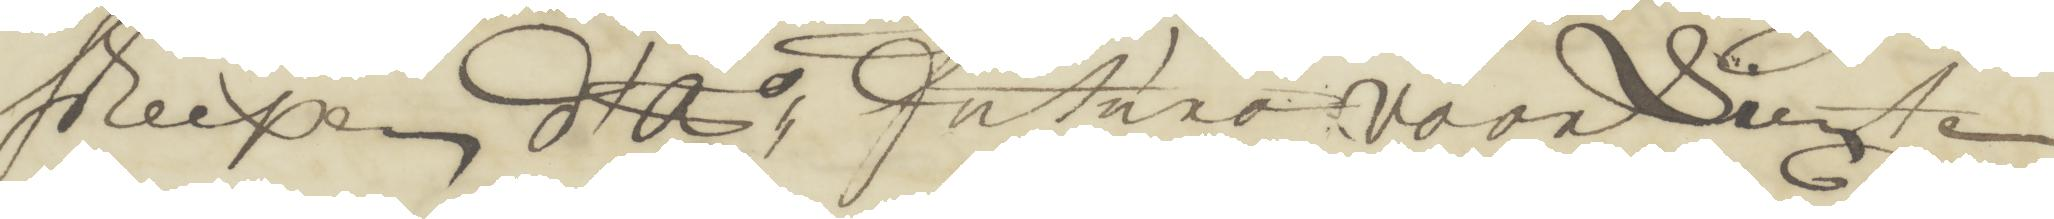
scheepen d' a„o futuro voorsien te
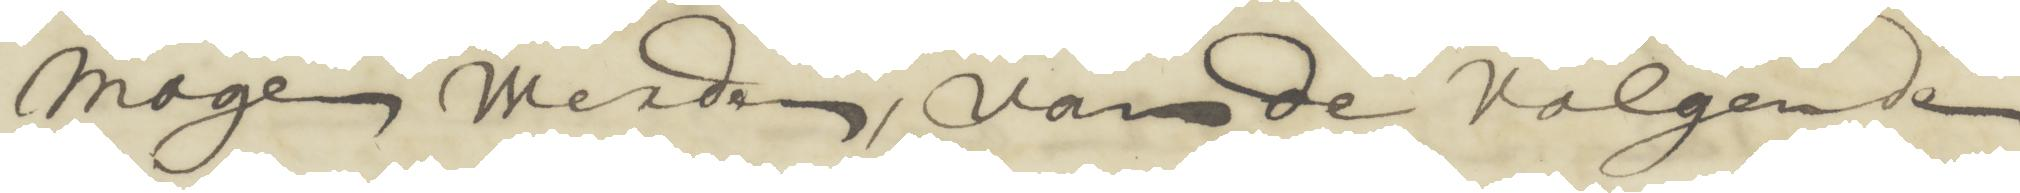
mogen werden, van de volgende
